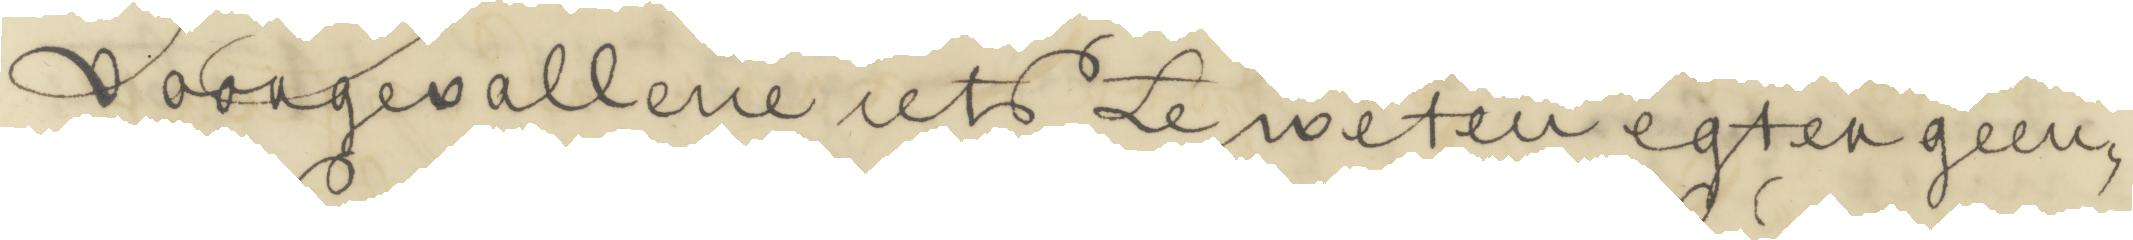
voorgevallene iets te weten egter geen„
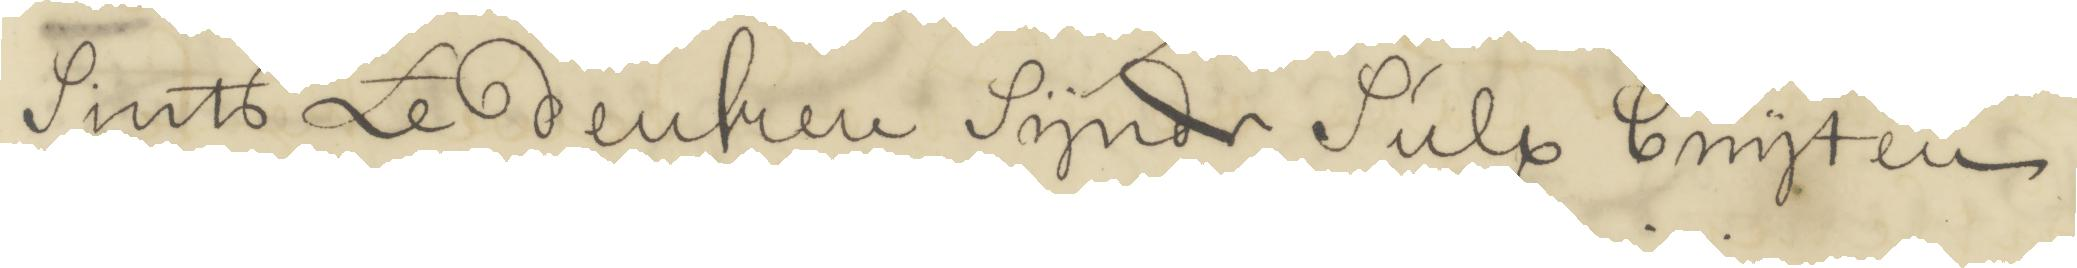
sints te denken sijnde sulx buijten
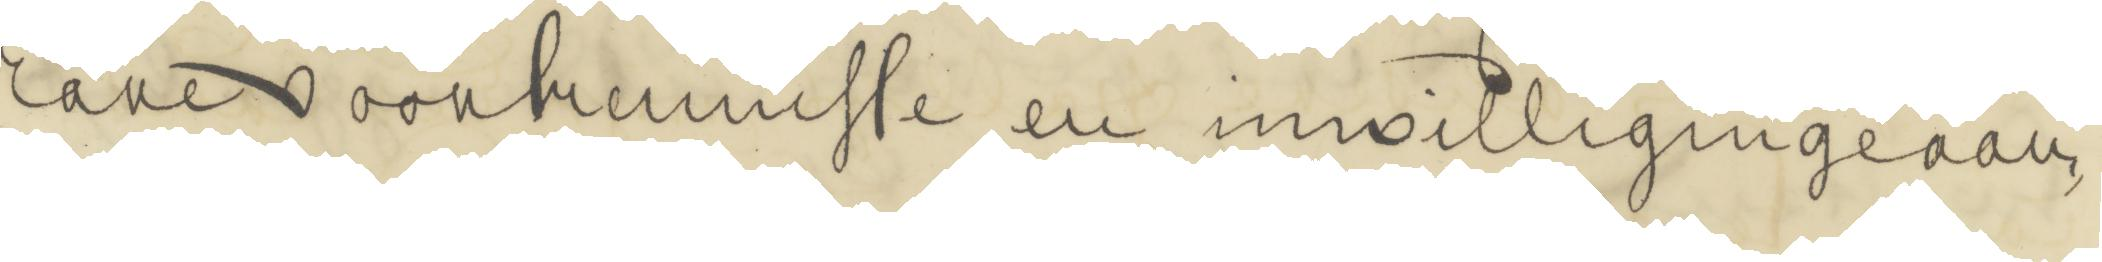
hare voorkennisse en inwilliginge aan„
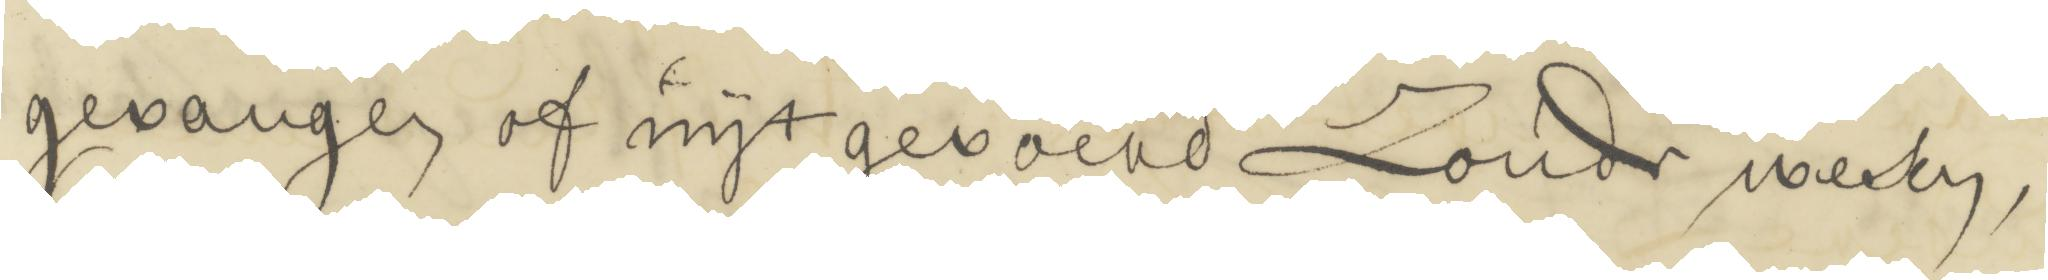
gevangen of uijt gevoerd zoude wesen,
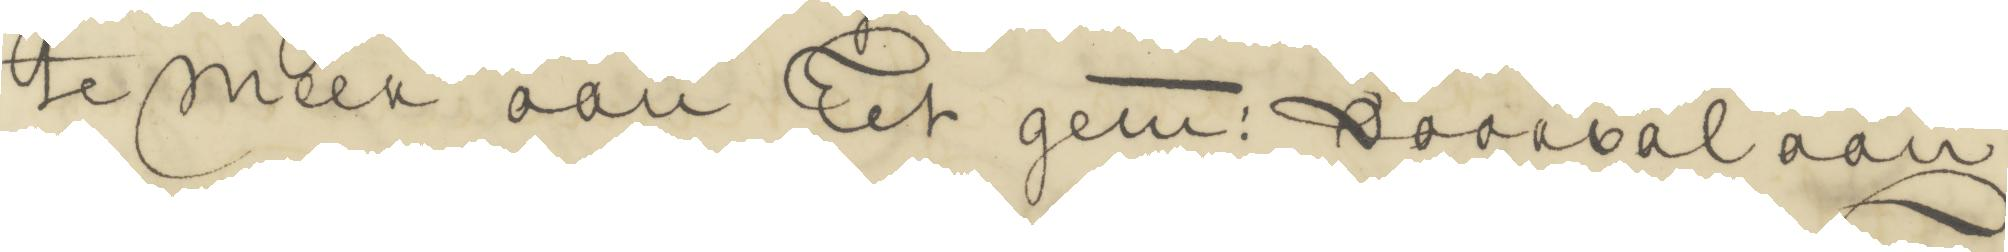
te meer aan het gem: voorval aan
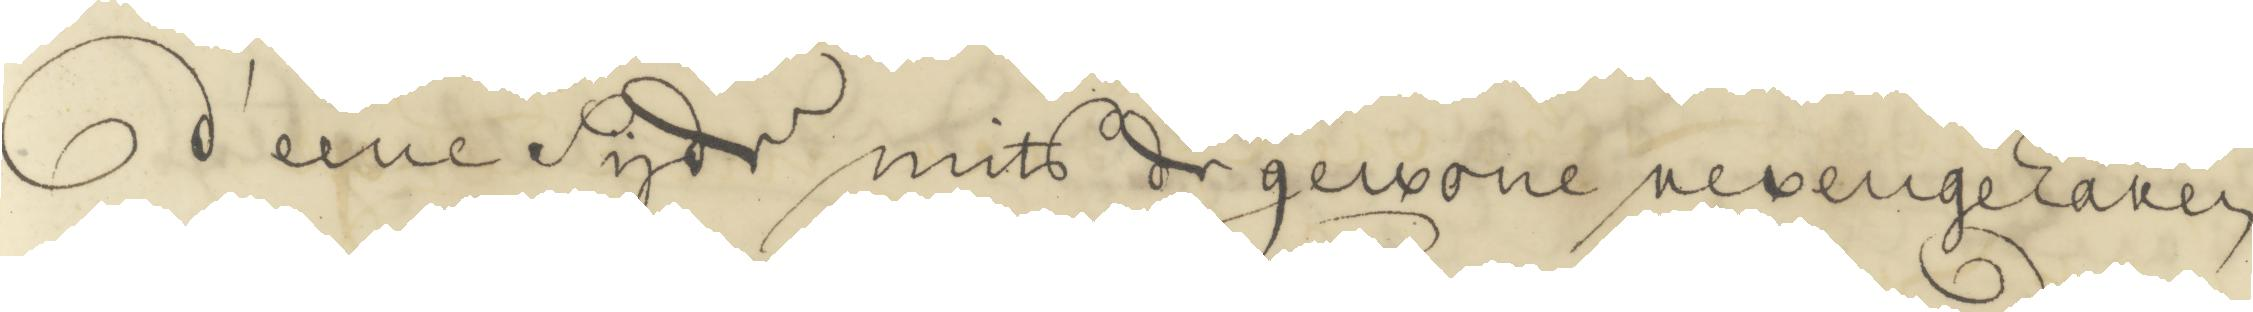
d’ eene sijde mits de gewone revengeharen
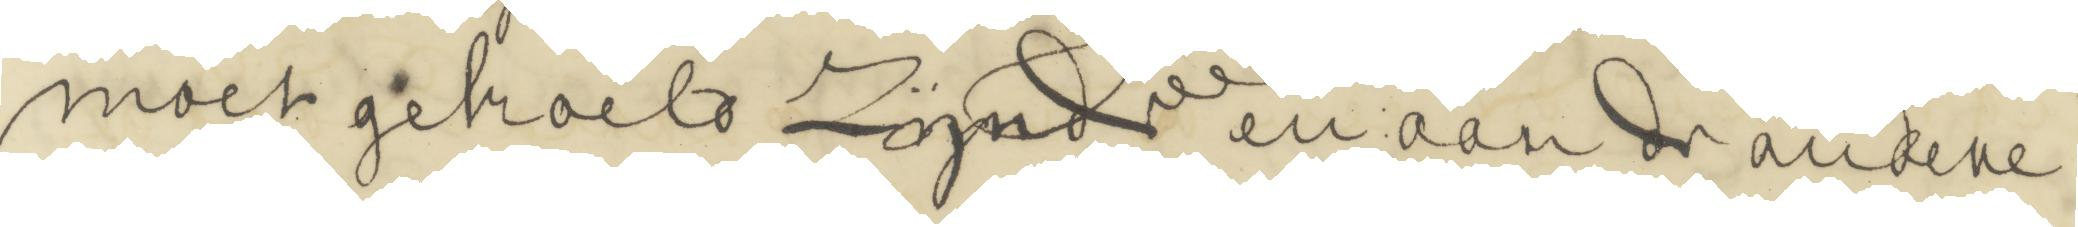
moet gekoeld zijnde en aan de andere
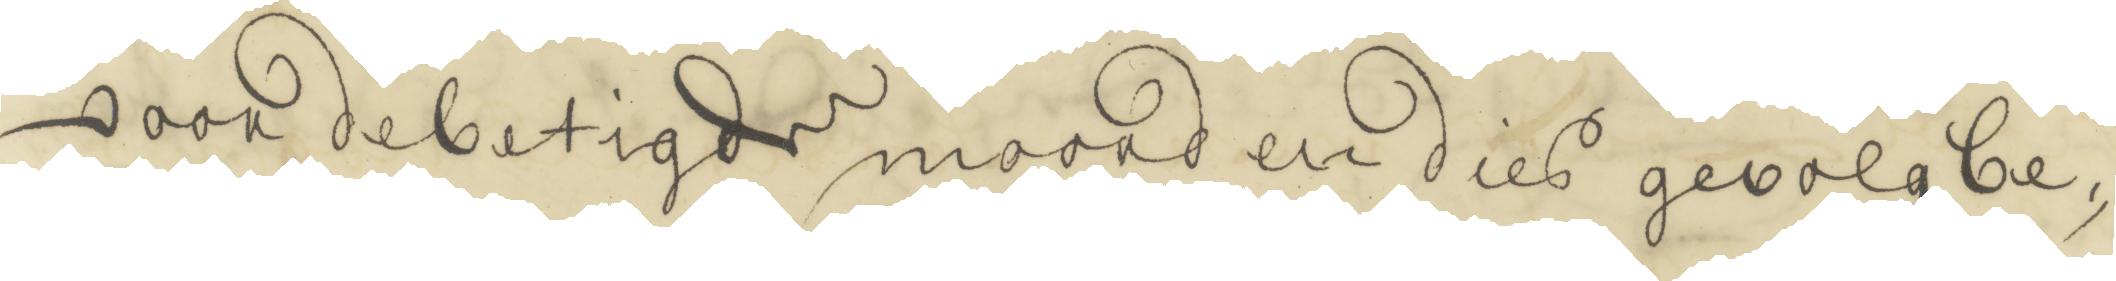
voor de betigde moord en dies gevolg be„
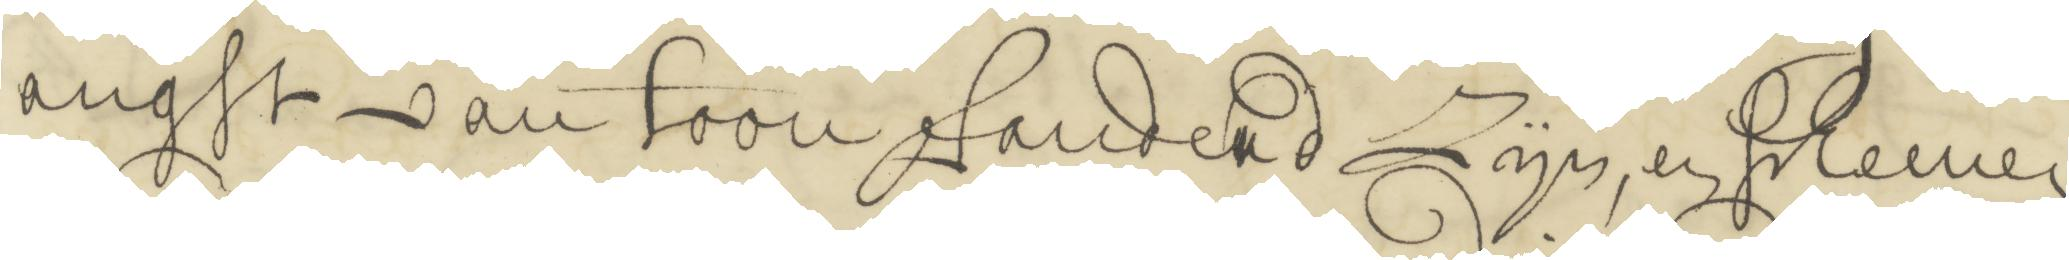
angst van toon veranderd zijn, en scheenen
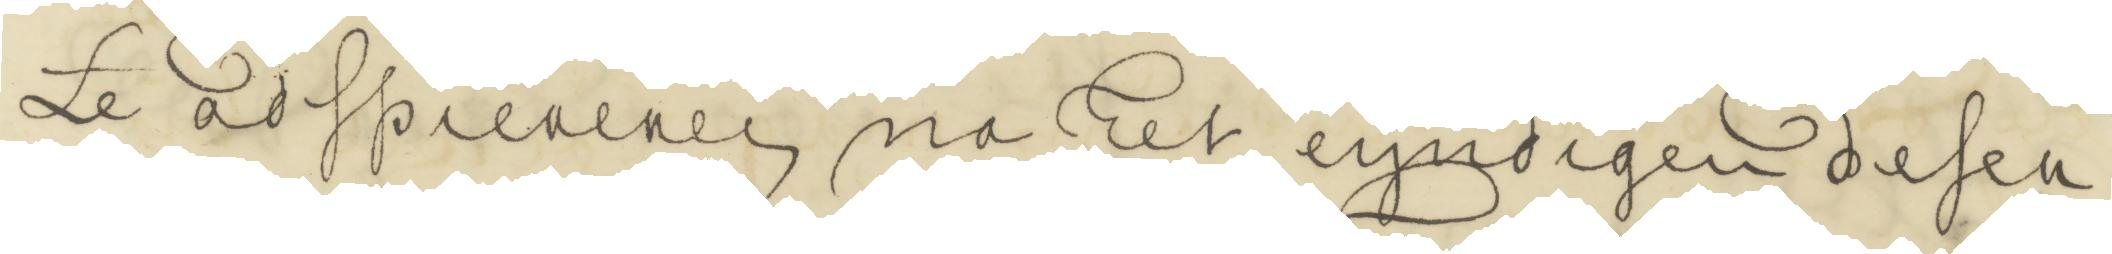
te adspiereren na het eijndigen deser
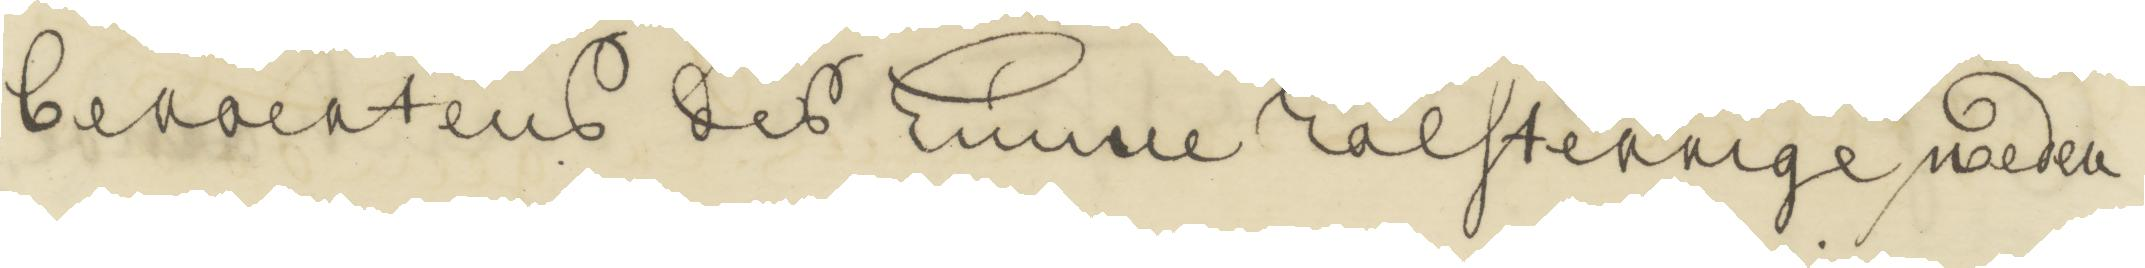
beroertens des hunne halsterrige weder
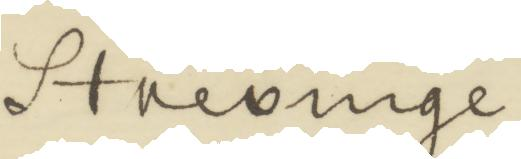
strevinge
